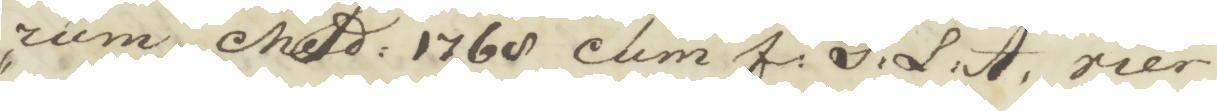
„rum, Med: 1768 cum f: S: L: A, vier
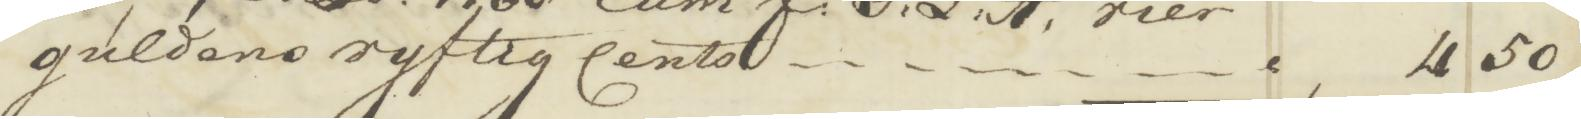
guldens vyftig cents - - - - - - - - „4 50
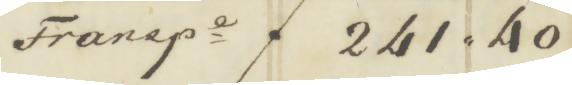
Transp=e ƒ 241„ 40
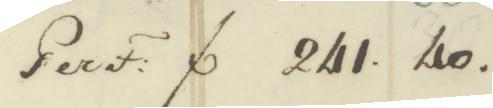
Per T: ƒ 241. 40.
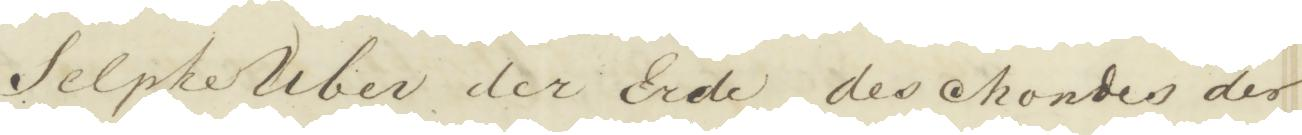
Selpke Uber der Erde, des Mondes der
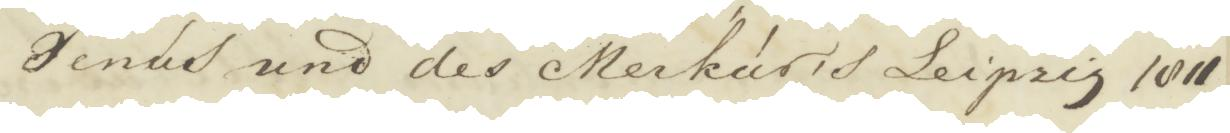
Venus und des Merkur's Leipzig 1811,
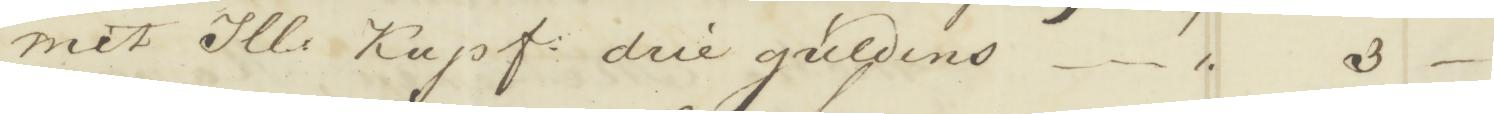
mit Ill: Kupf: drie guldens - - - „ 3 —
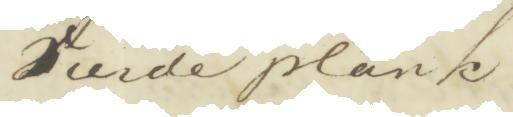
Vierde plank
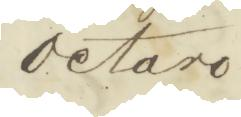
Octavo
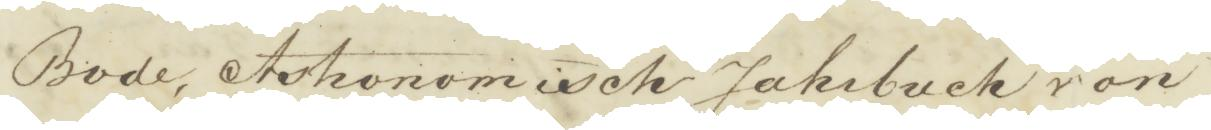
Bode, Astronomisch Jahrbuch von
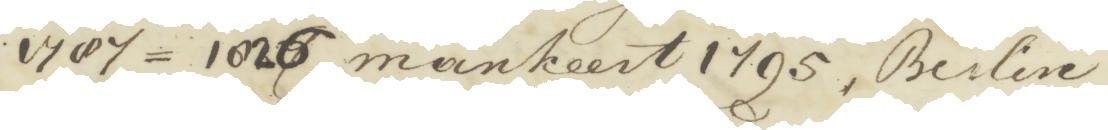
1787 = 1826, mankeert 1795, Berlin
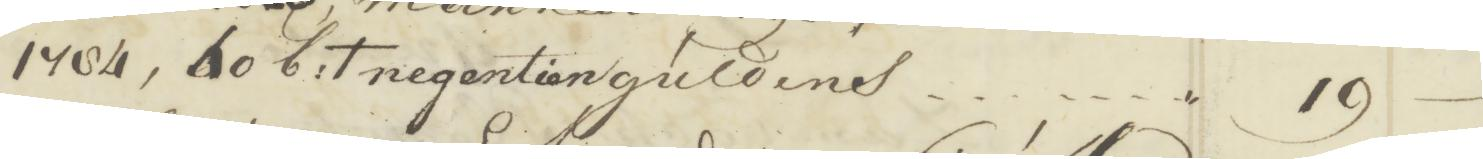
1784, 40 b:† negentien guldens - - - - - - „ 19 —
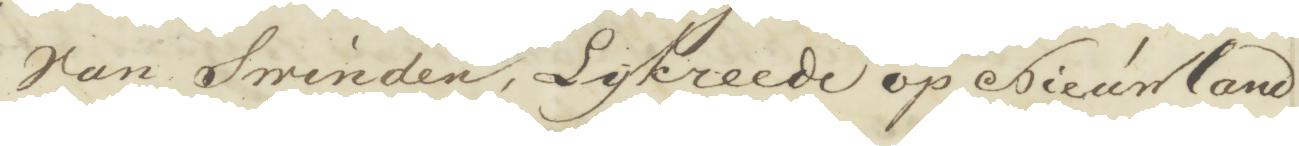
van Swinden, Lijkreede op Nieuwland
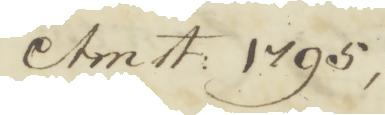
Amst: 1795,
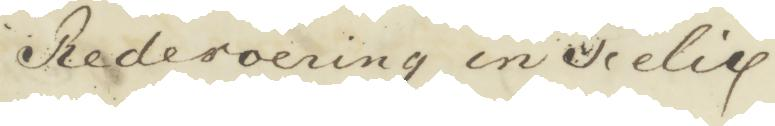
Redevoering in Felix
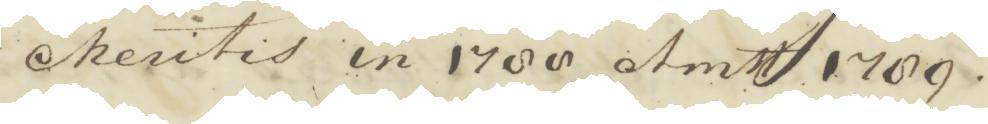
Meritis in 1788 Amst 1789
